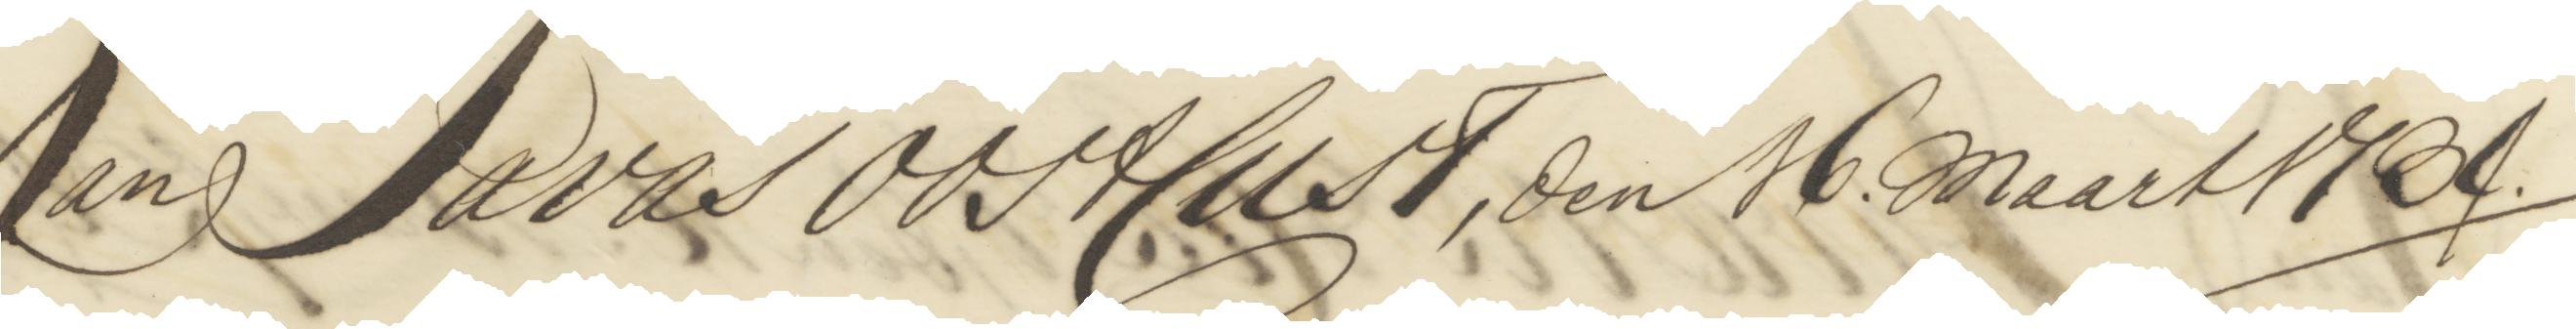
Van Javas oostCust, den 16. maart 1734.
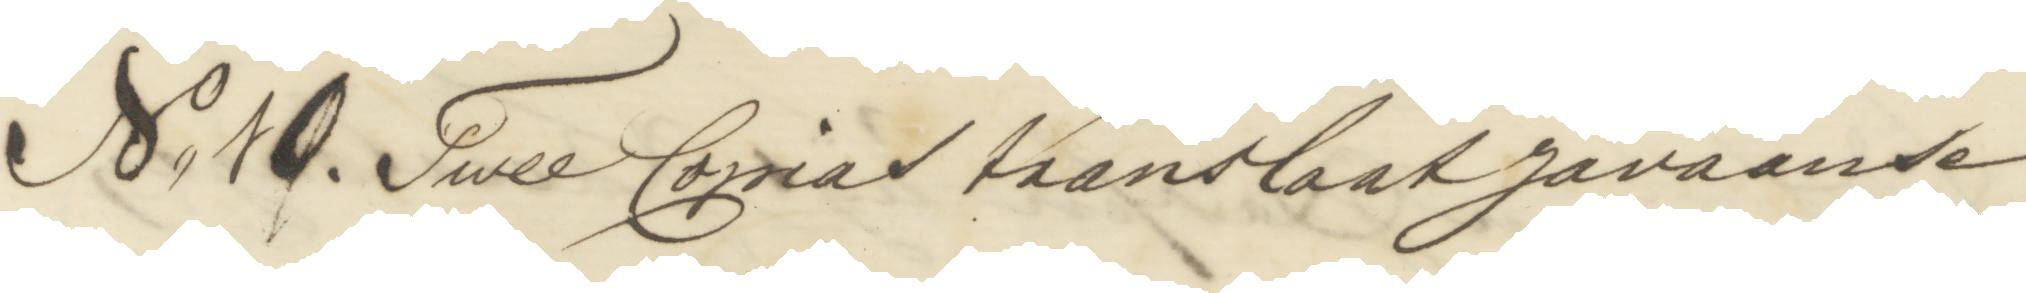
N„o 10. Twee Copias translaat javaanse
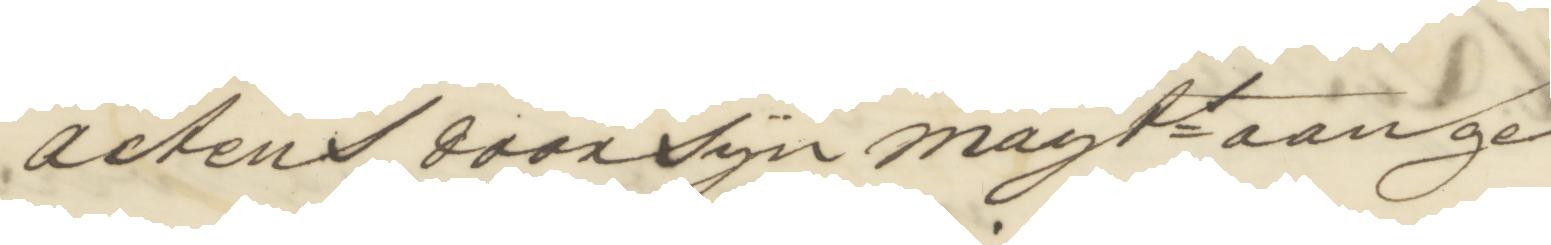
actens door sijn maijs=t aan ge
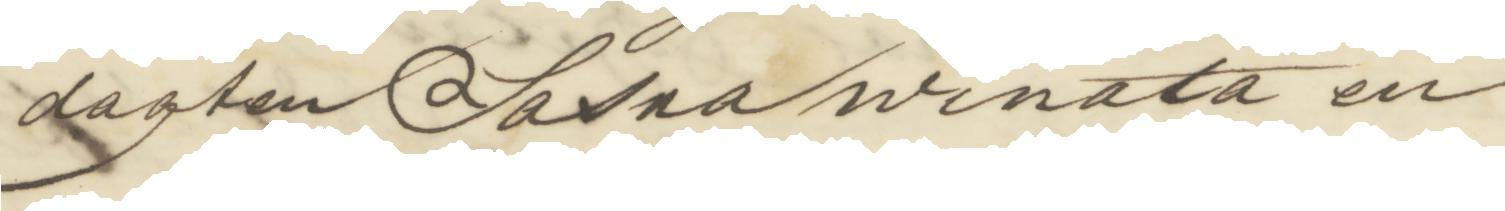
dagten Sasra winata en
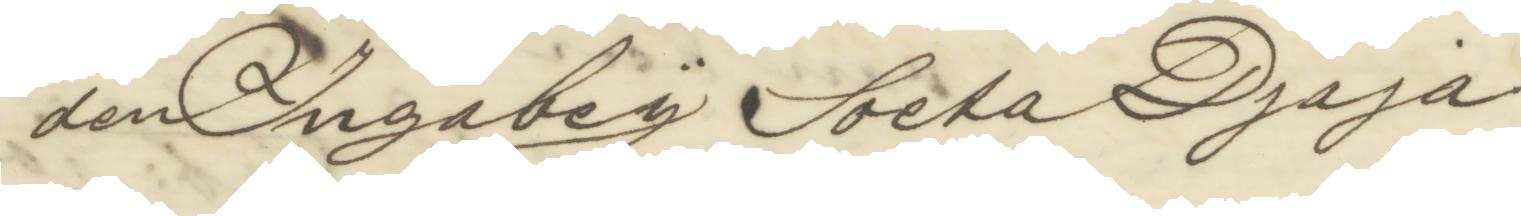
den Ingabeij Soeta Djaja
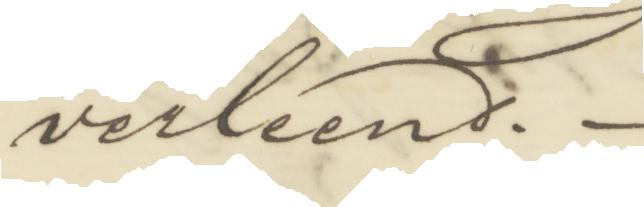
verleend. —
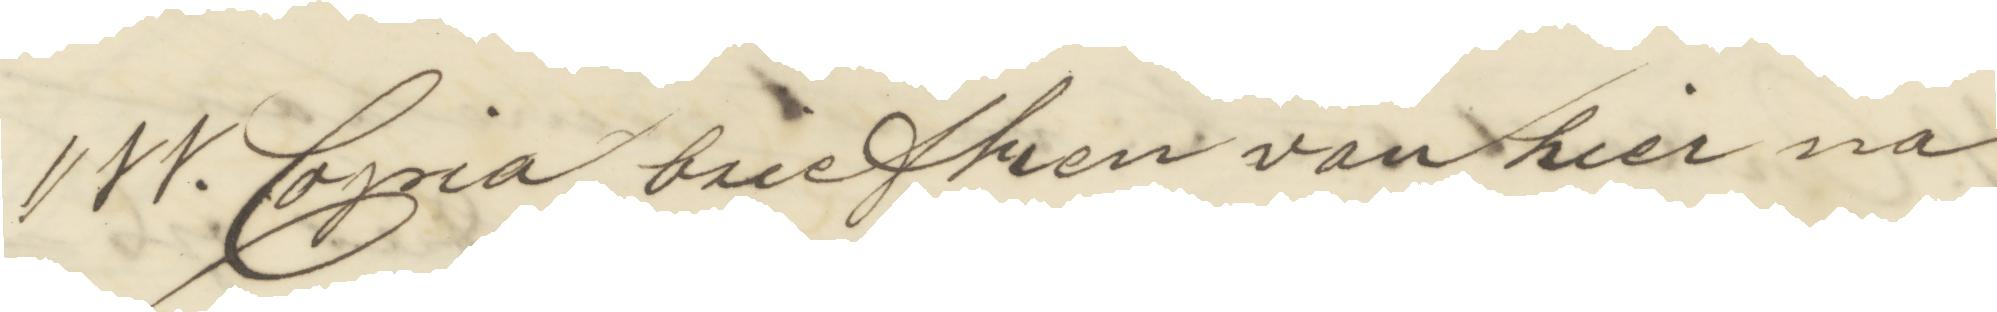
„ 11. Copia briefken van hier na
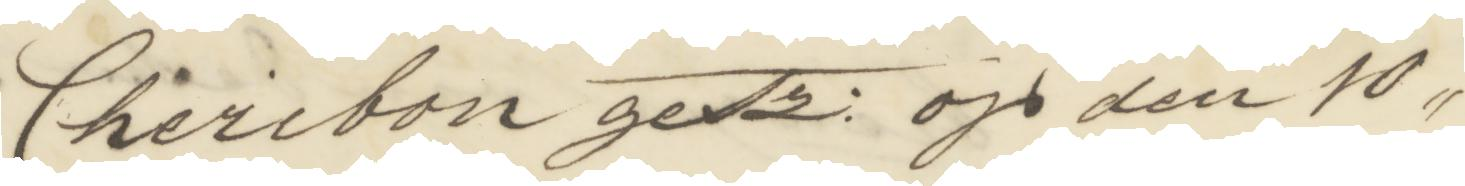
Cheribon gesz: op den 10„
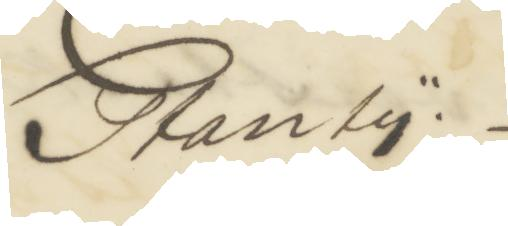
stantij. -
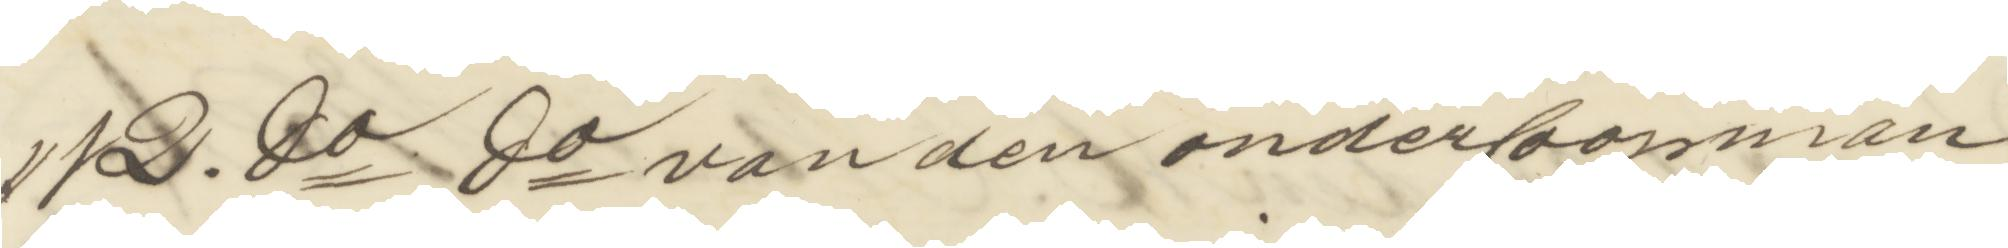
„ 12. d=o d=o van den onderCoopman
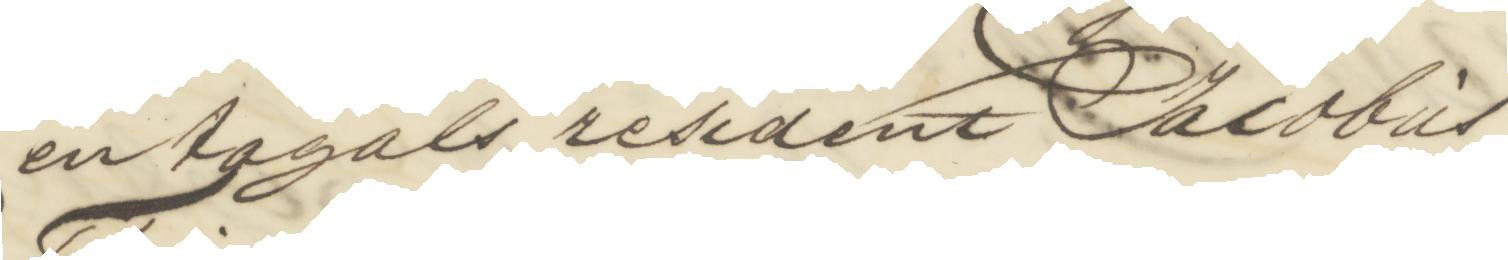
en tagals resident Iacobus
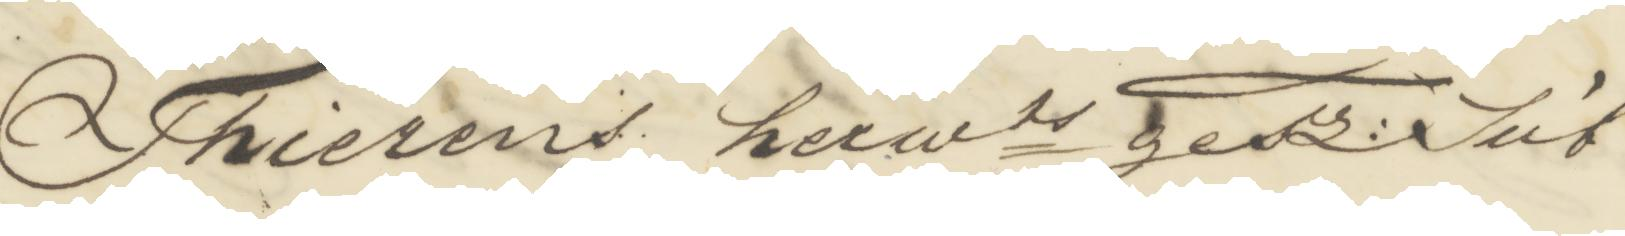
Thierens herw=ts gesz: sub
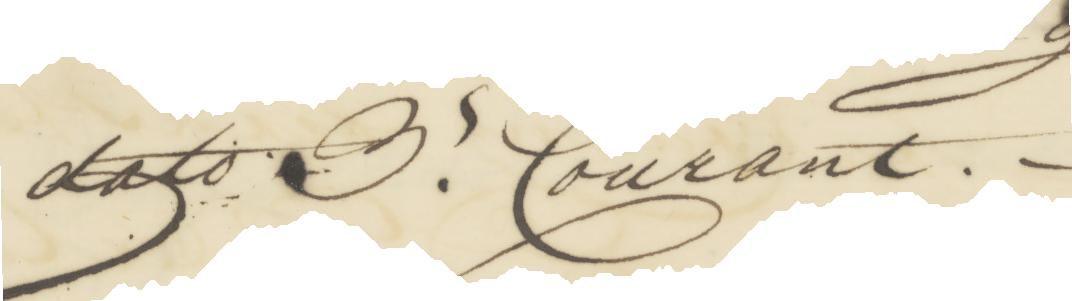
dato 3.' Courant. —
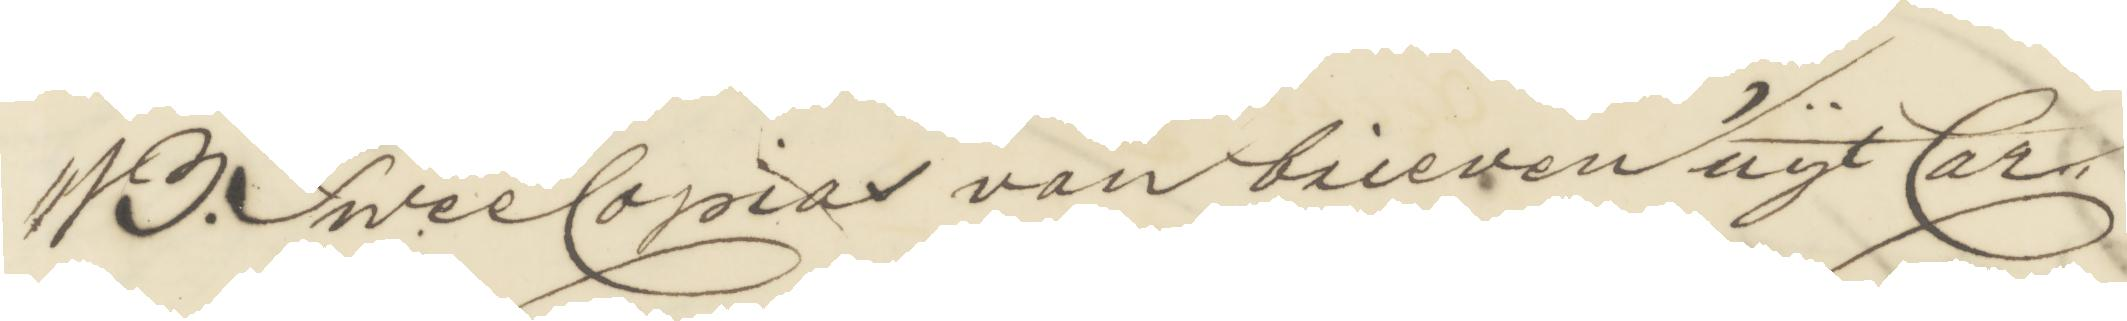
„ 13. Twee Copias van brieven uijt Car„
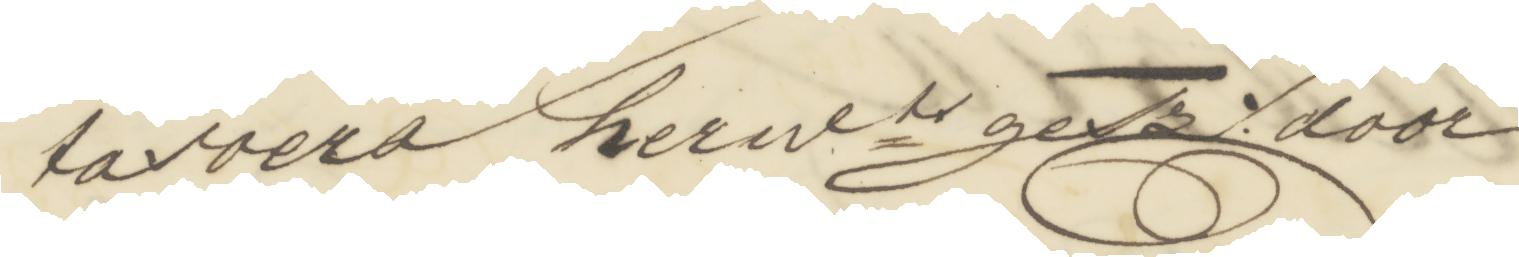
tasoera herw=ts gesz: door
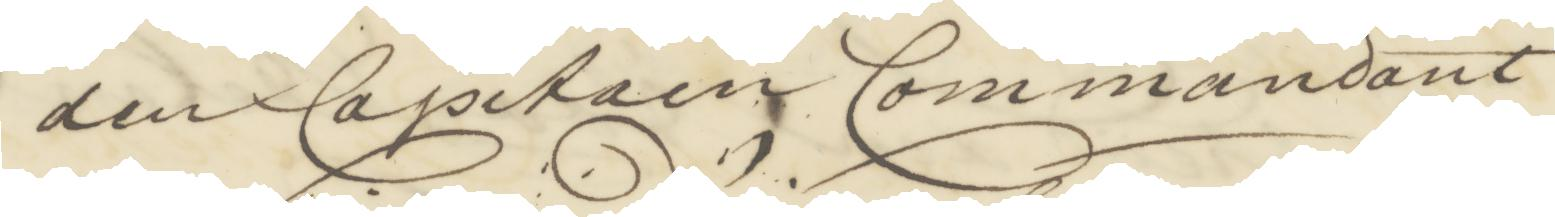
den Capitain Commandant
